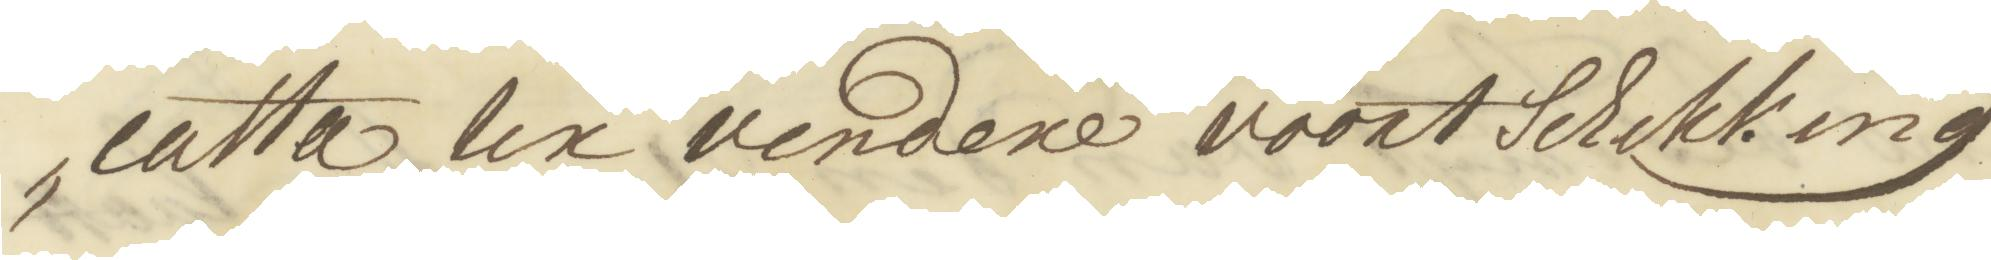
„catta ter verdere voort schikking
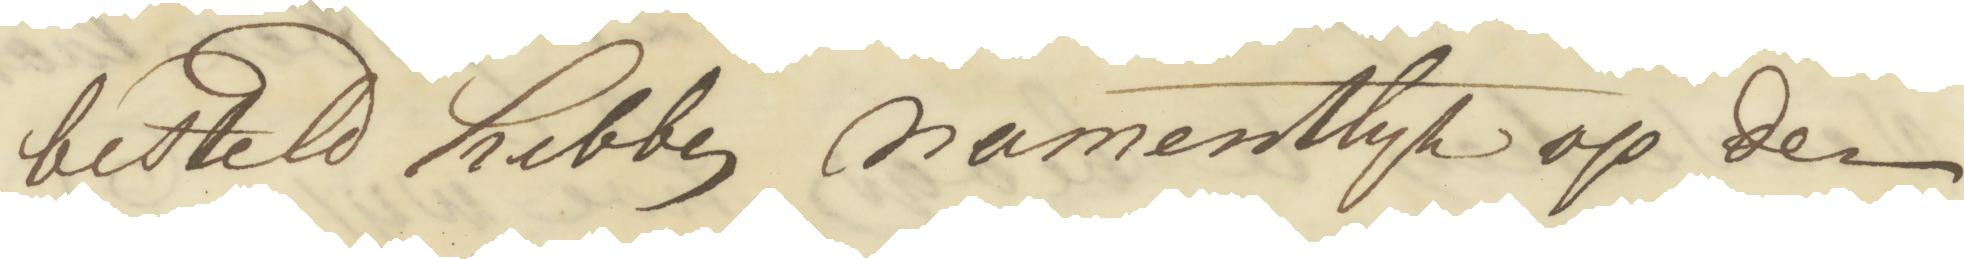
besteld hebben namentlyk op den
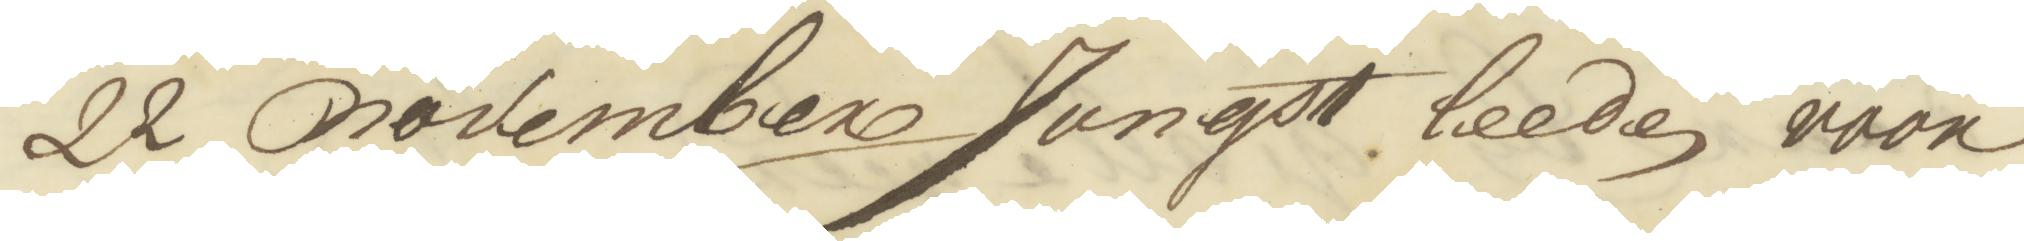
22 november Jongst leeden voor
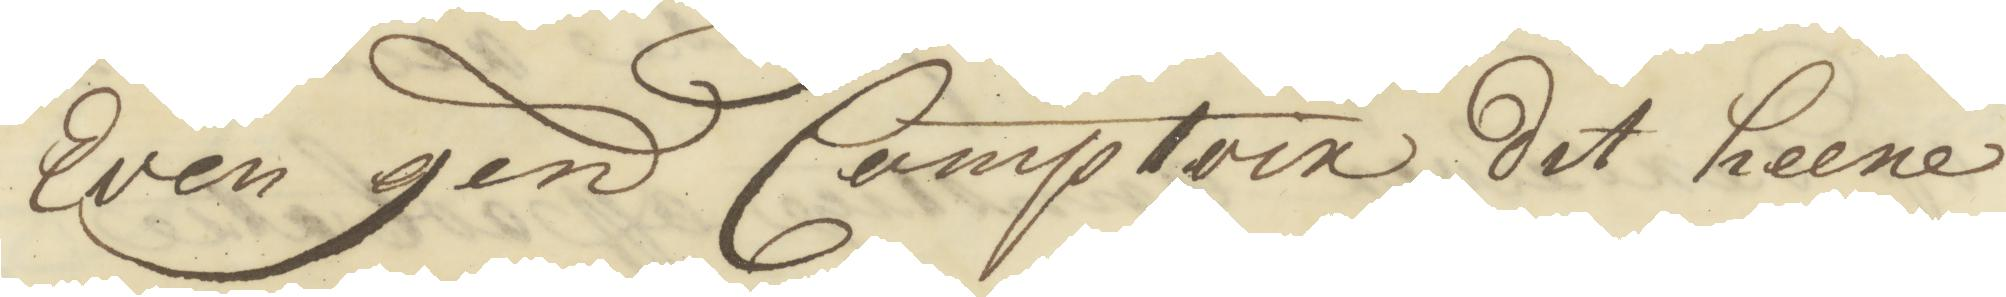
Even gen Comptoir dit heere
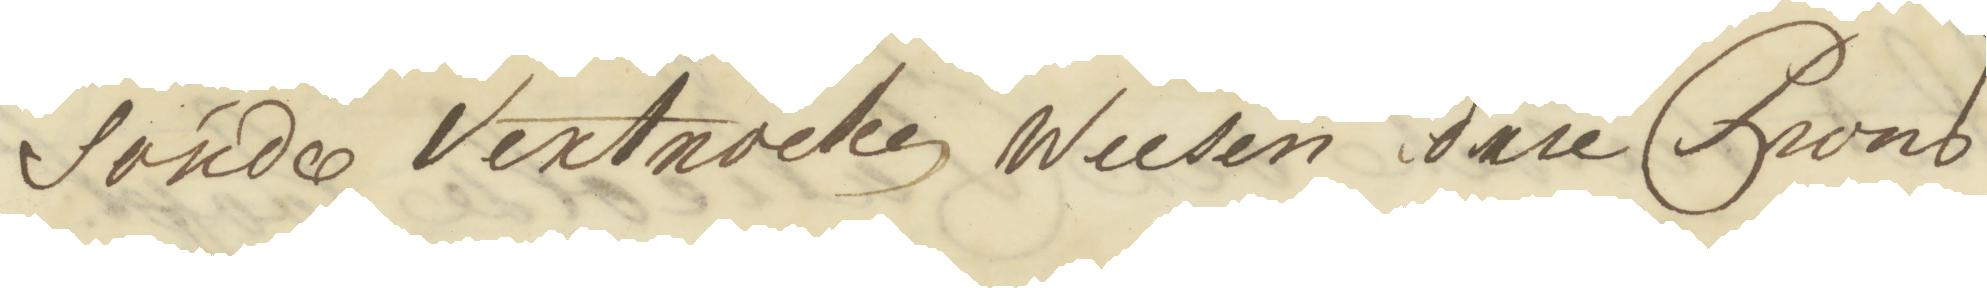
soude vertrocken weesen drie Prons
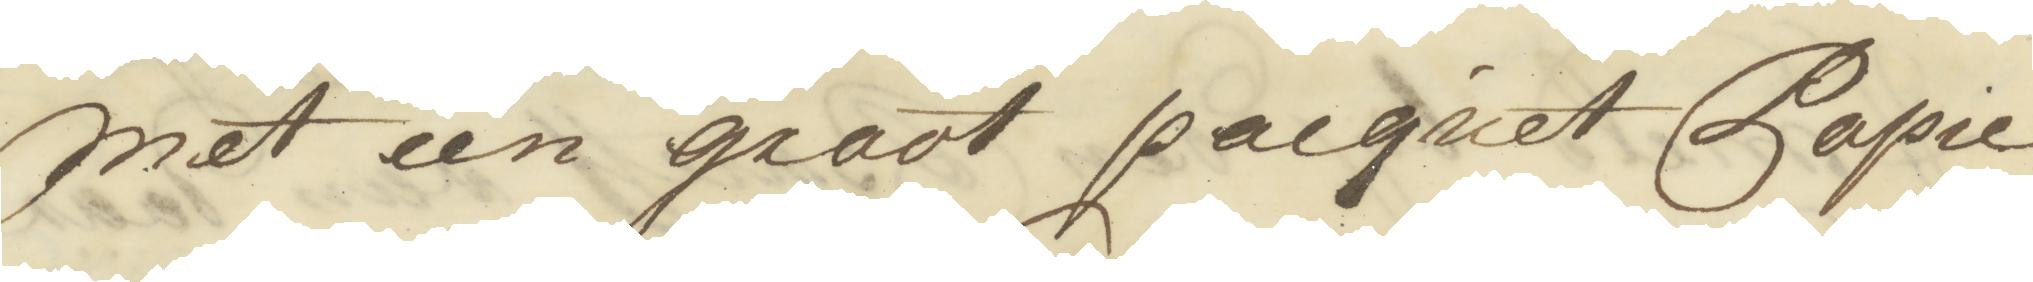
met een groot pacquet Papie
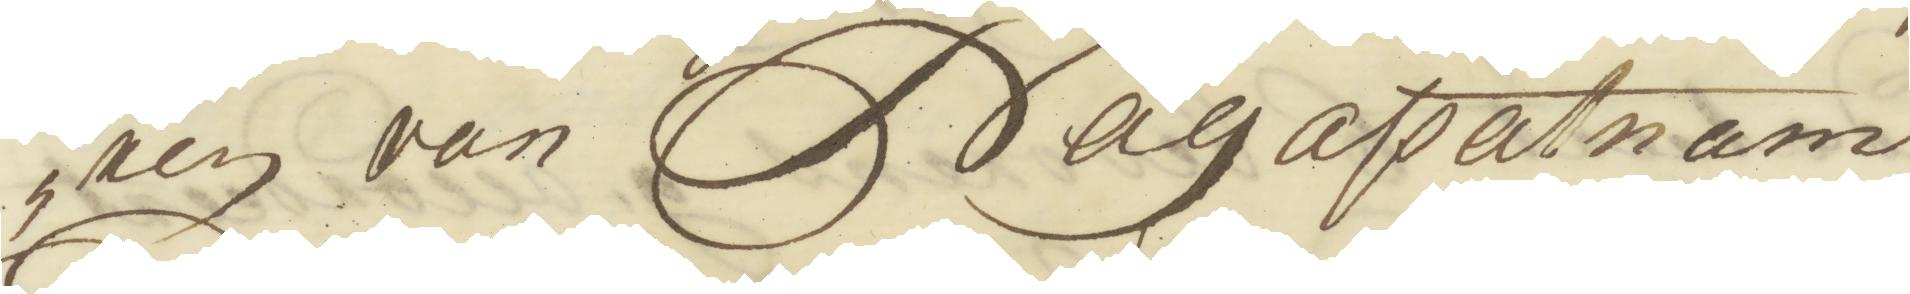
„ren van Nagapatnam
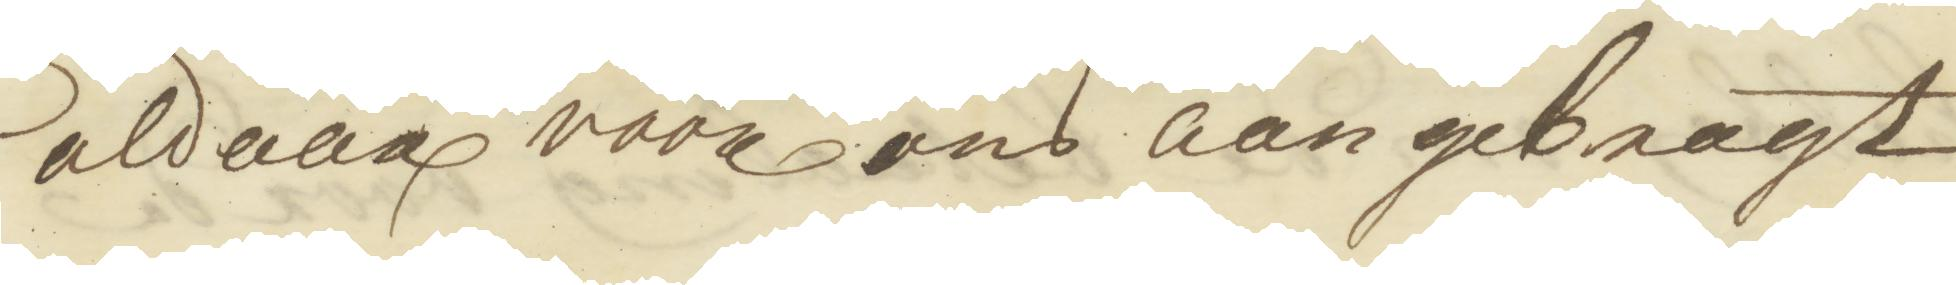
aldaar voor ons aan gebragt
